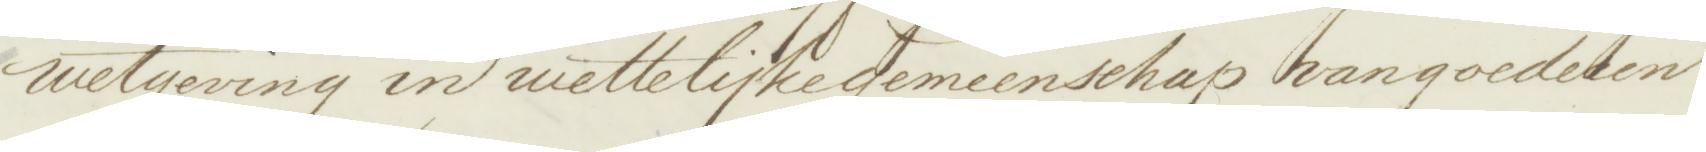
wetgeving in wettelijke gemeenschap van goederen
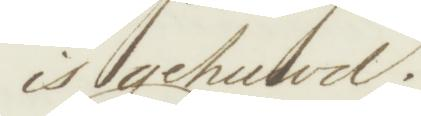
is gehuwd.
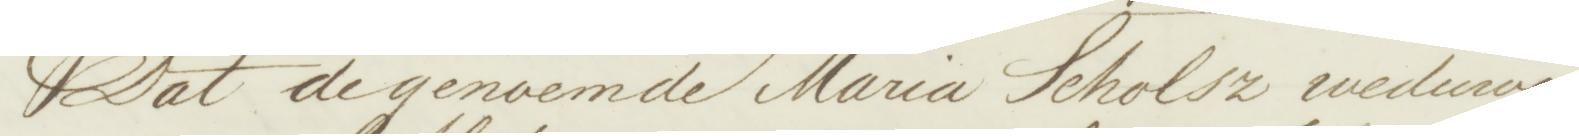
Dat de genoemde Maria Scholsz weduwe
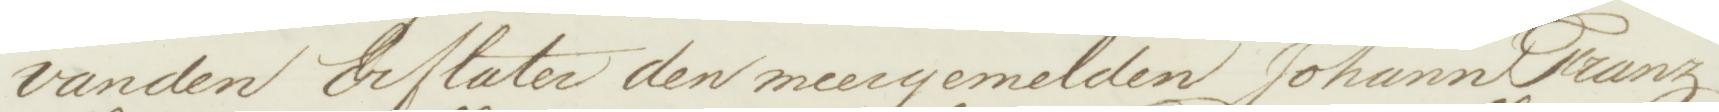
van den Erflater den meergemelden Johann Franz
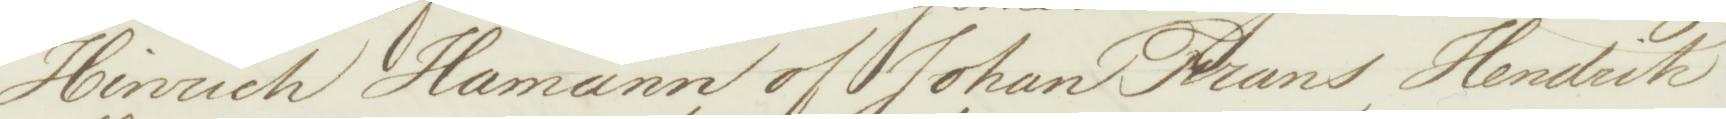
Hinrich Hamann of Johan Frans Hendrik
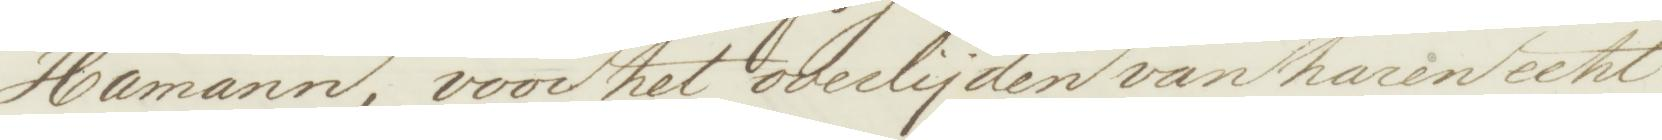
Hamann, voor het overlijden van haren echt
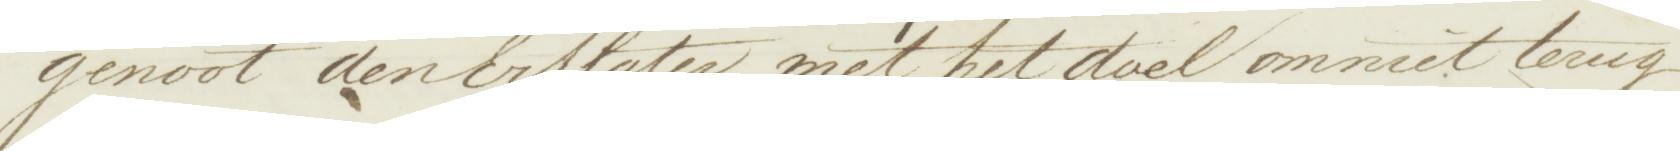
genoot den Erflater met het doel om niet terug
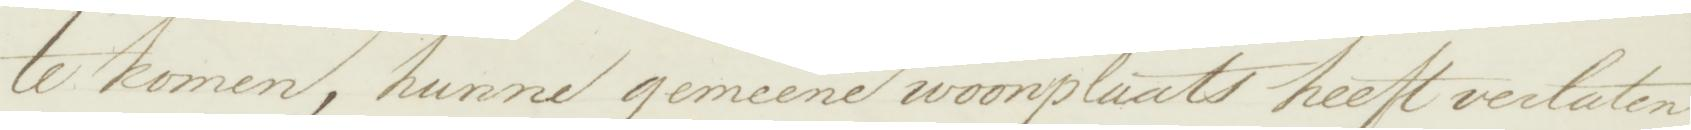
te komen, hunne gemeene woonplaats heeft verlaten
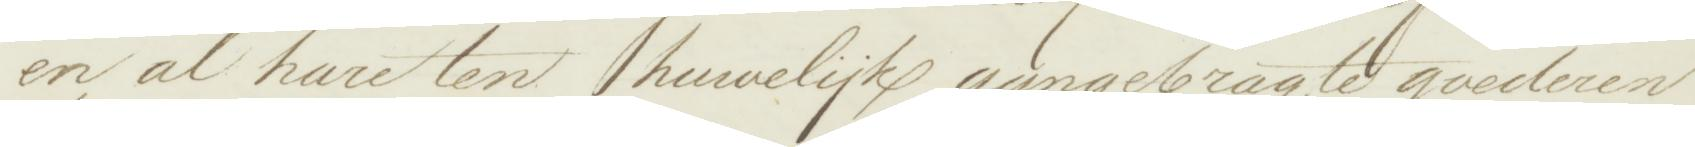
en al hare ten huwelijk aangebragte goederen
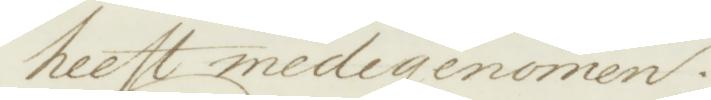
heeft medegenomen.
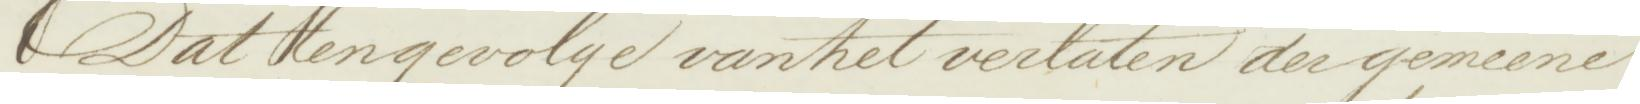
Dat tengevolge van het verlaten der gemeene
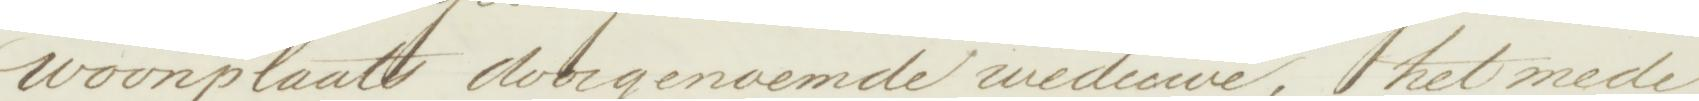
woonplaats doorgenoemde weduwe, het mede
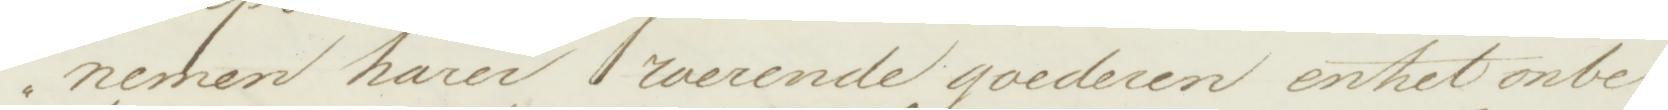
„ nemen harer roerende goederen en het onbe
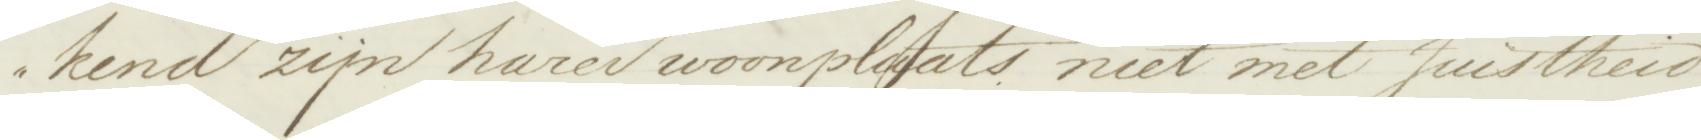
„kend zijn harer woonplaats, niet met Juistheid
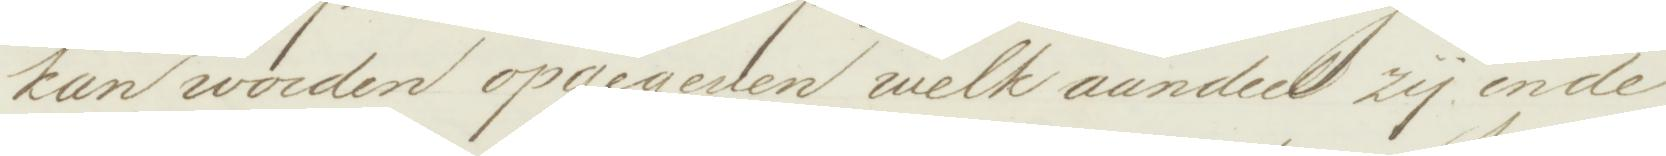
kan worden opgegeven welk aandeel zij in de
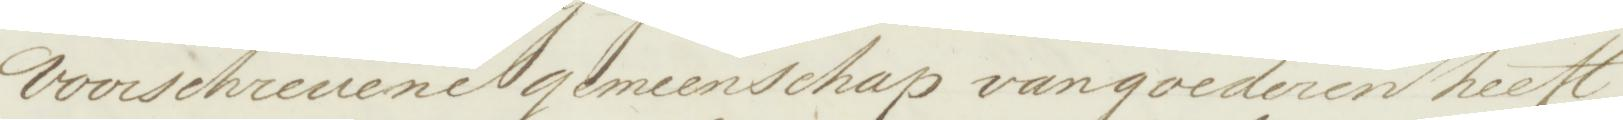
voorschrevene gemeenschap van goederen heeft
